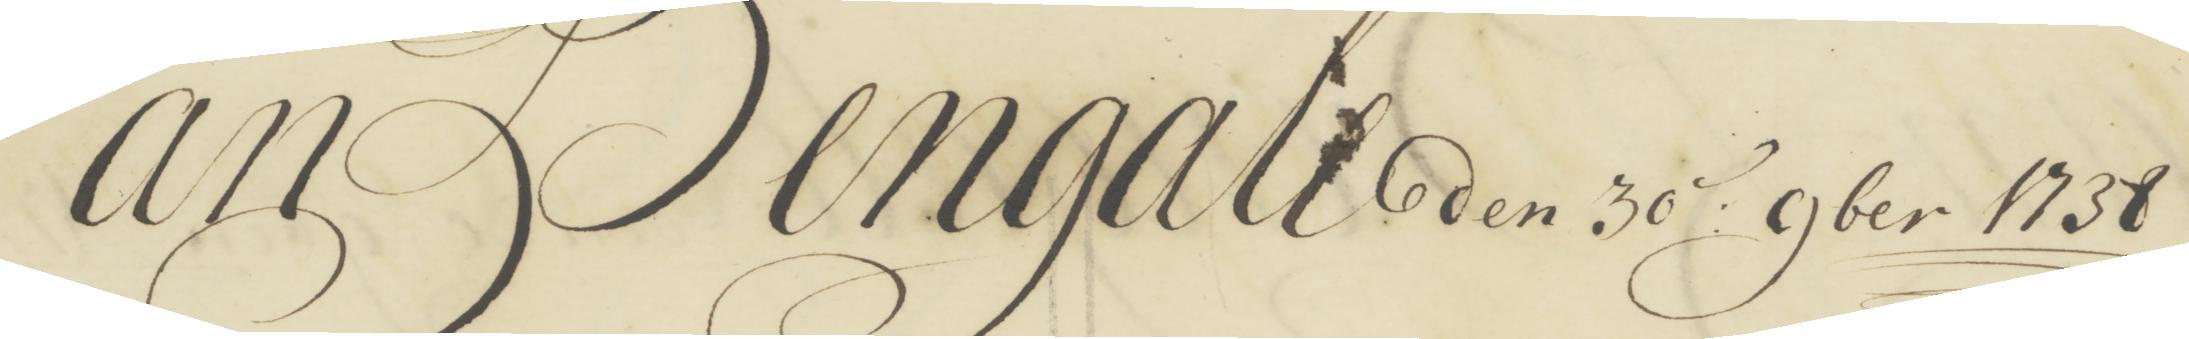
Van Bengale den 30:' 9ber 1738
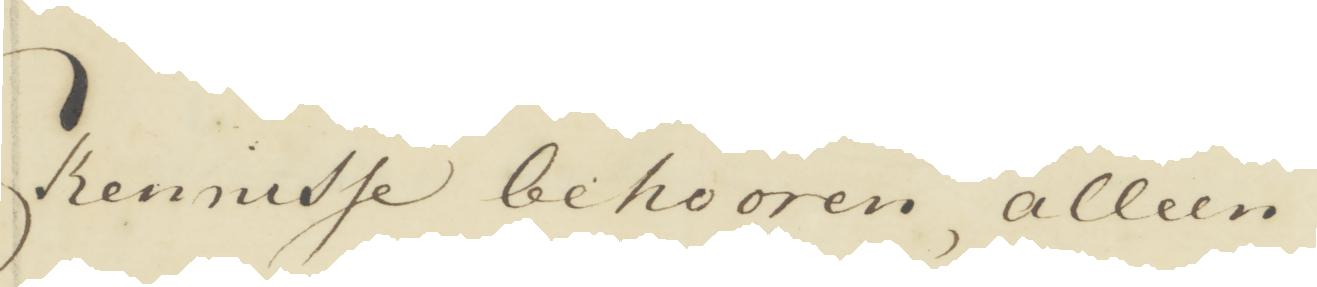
kennisse behooren, alleen
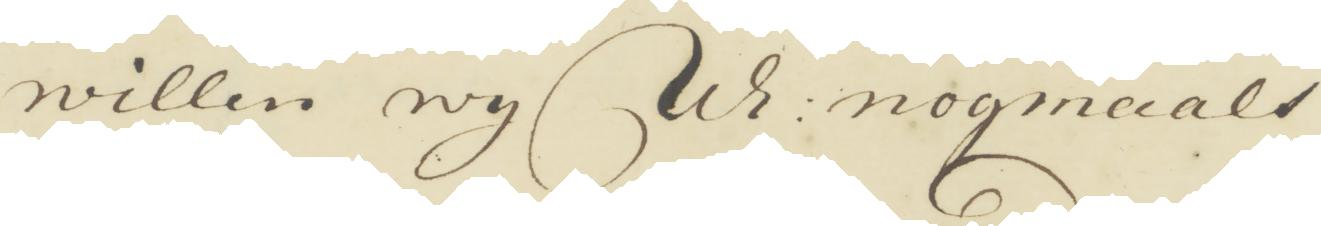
willen wy UE: nogmaals
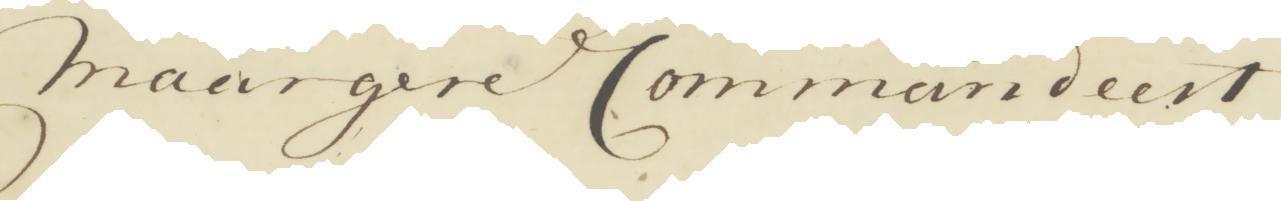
maar gerecommandeert
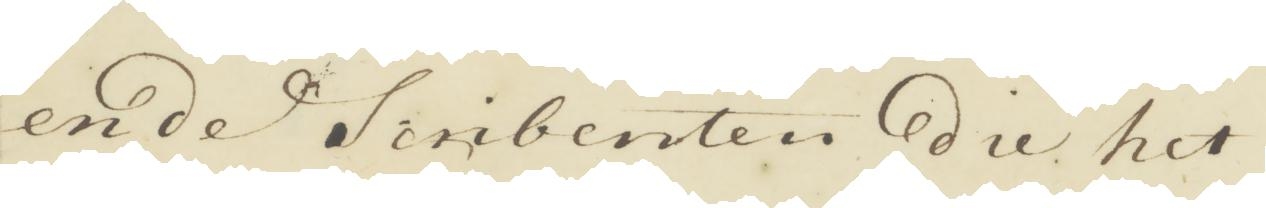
en de scribenten die het
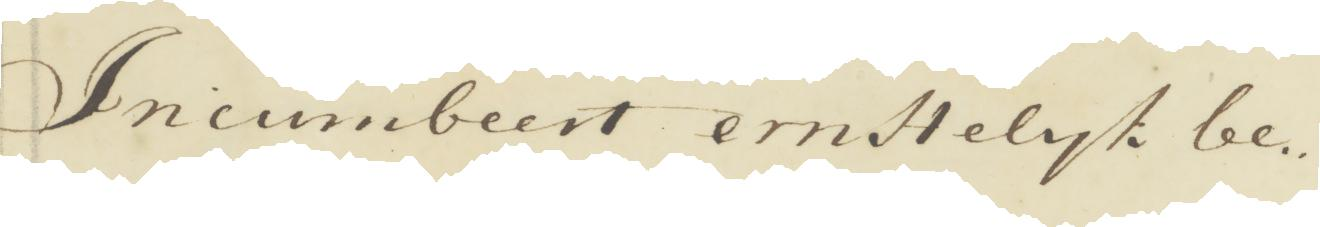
Incumbeert ernstelyk be„
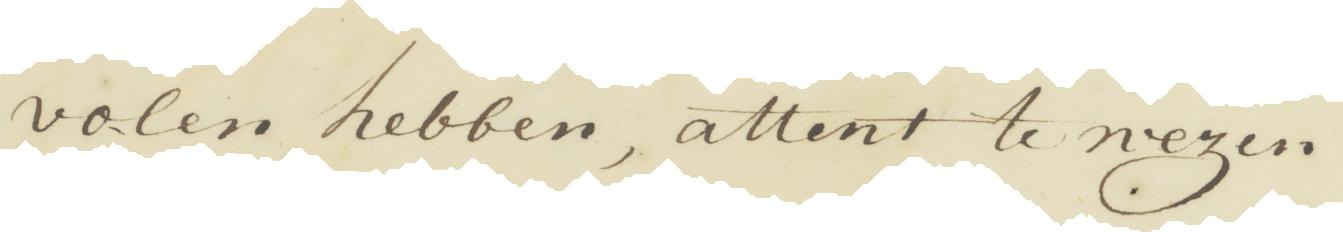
volen hebben, attent te wezen
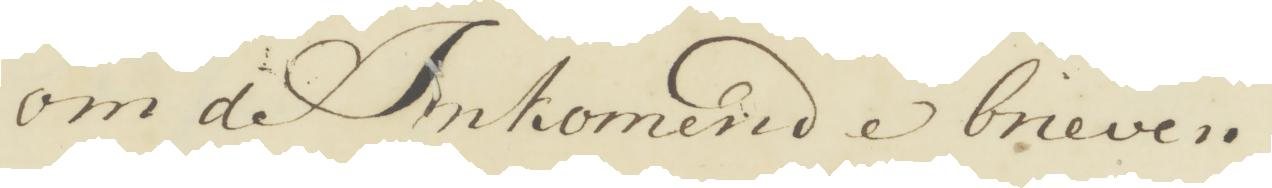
om de Inkomende brieven
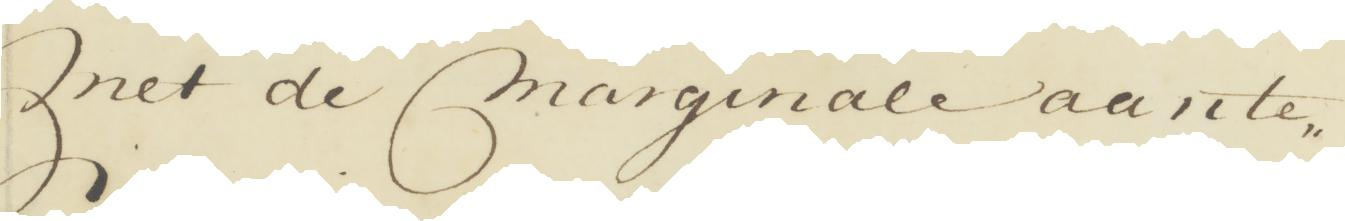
met de marginale aante„
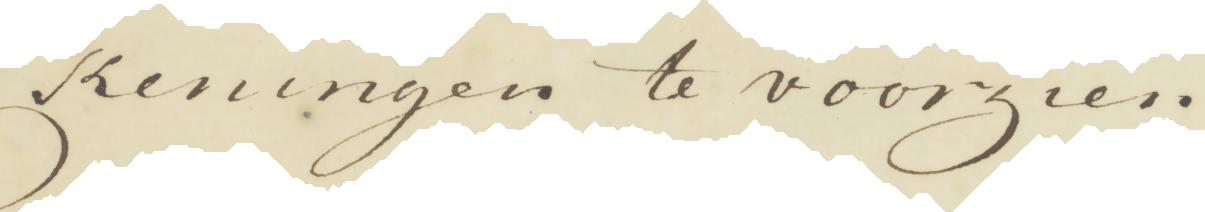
keningen te voorzien
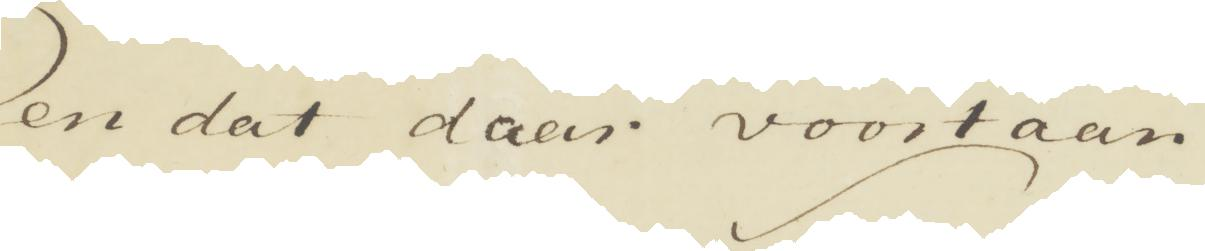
en dat daar voortaan
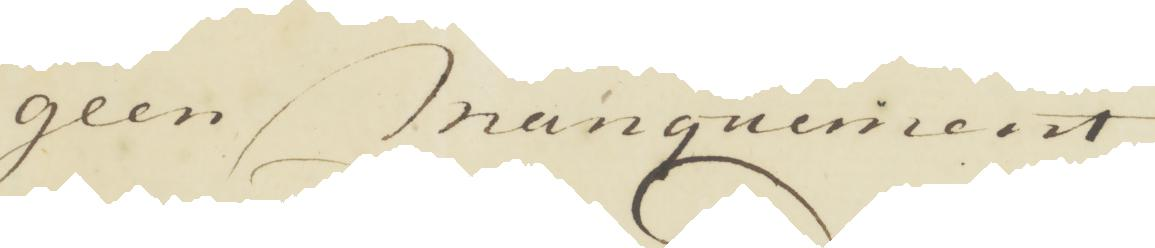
geen manquement
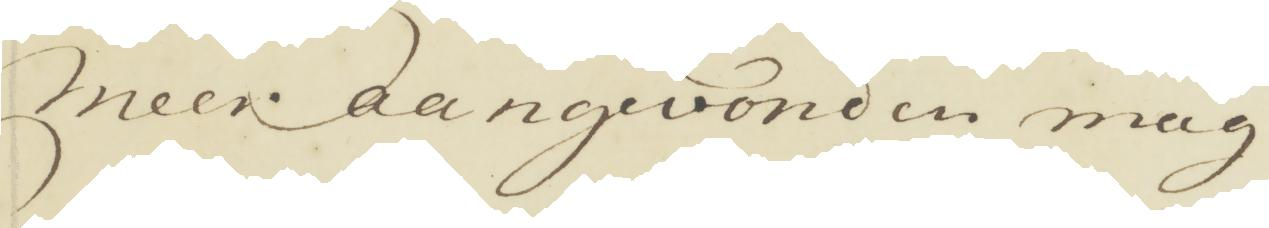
meer aangevonden mag
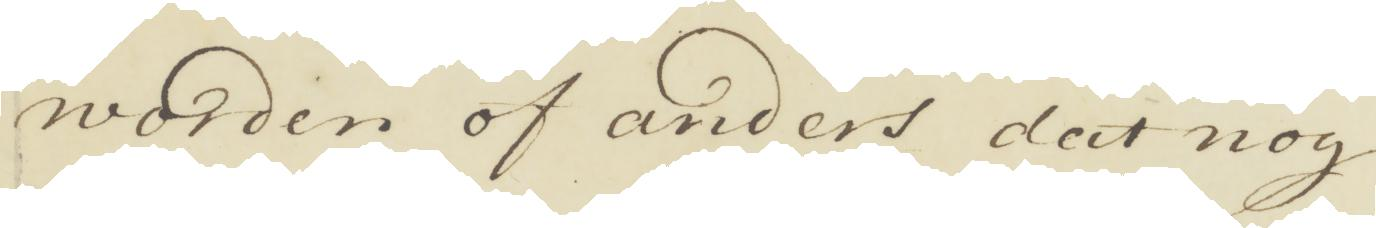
worden of anders dat nog
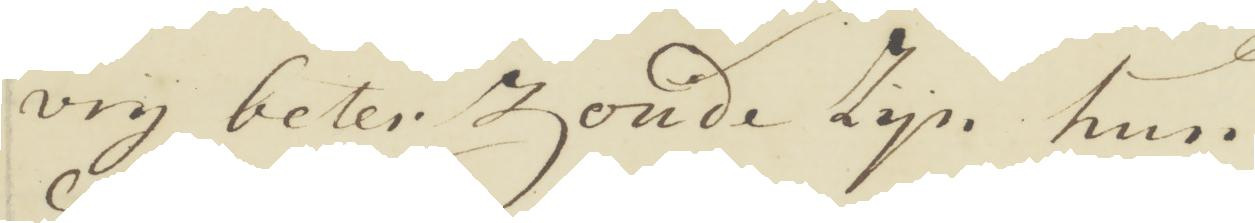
vrij beter zoude zijn hun
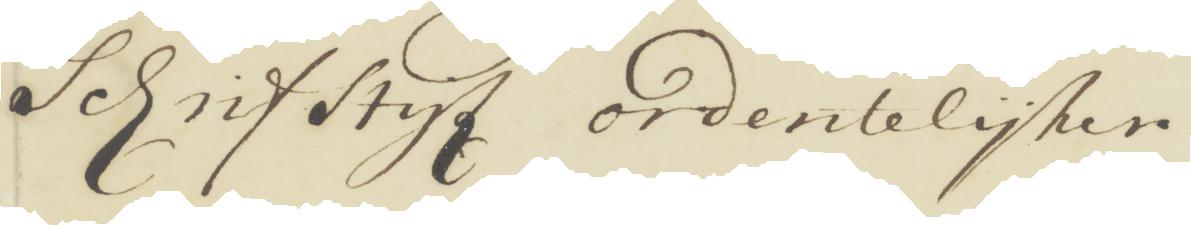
schrifstijl ordentelijker
